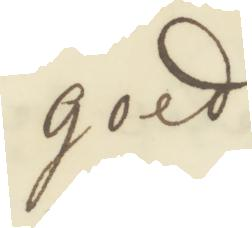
goed
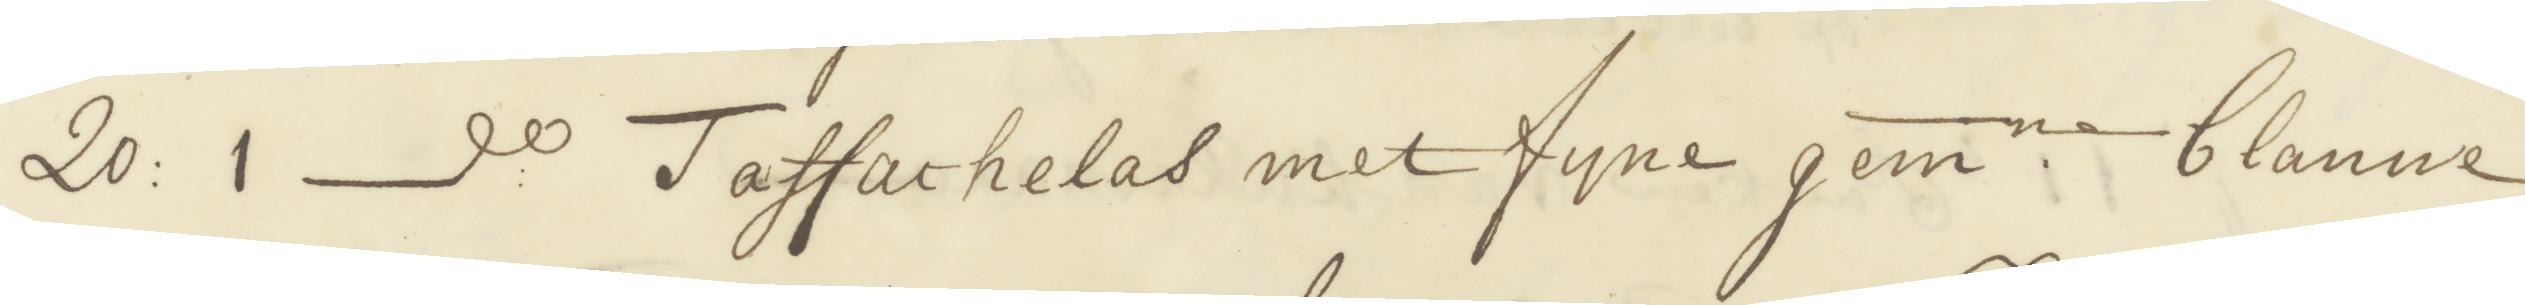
20: 1 —:o Taffachelas met fyne gem:ne blauwe
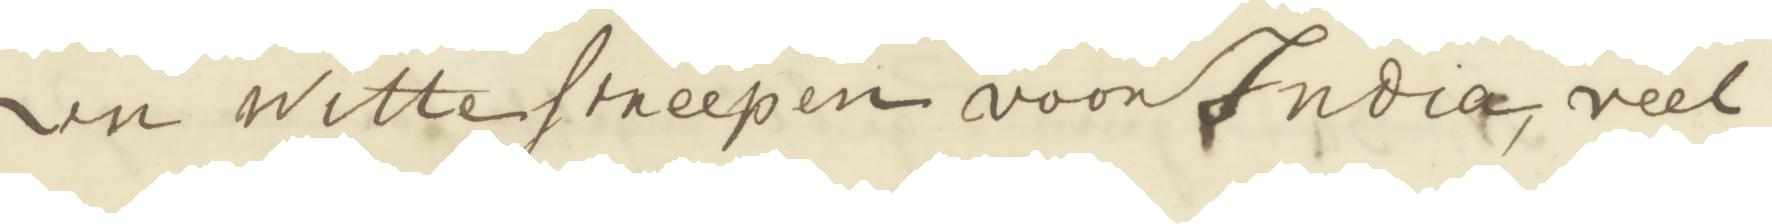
en witte streepen voor India, veel
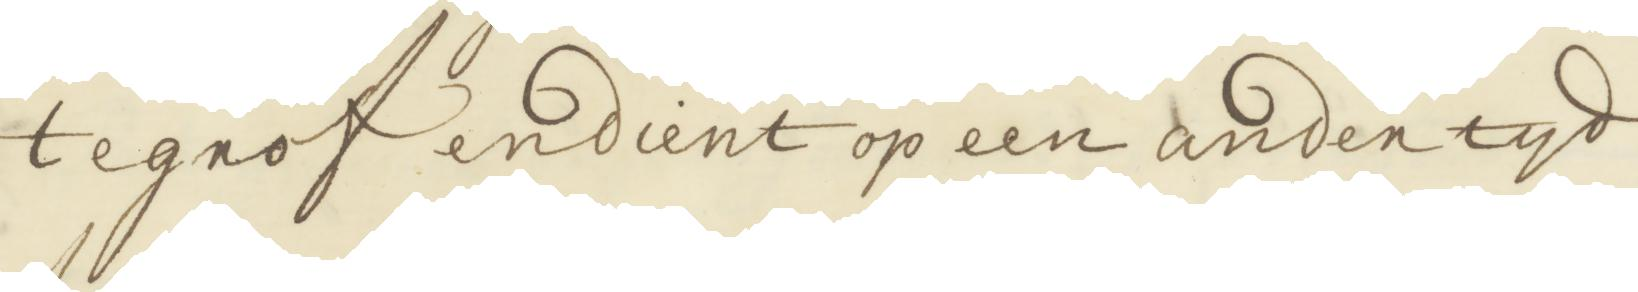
te grof en dient op een ander tyd
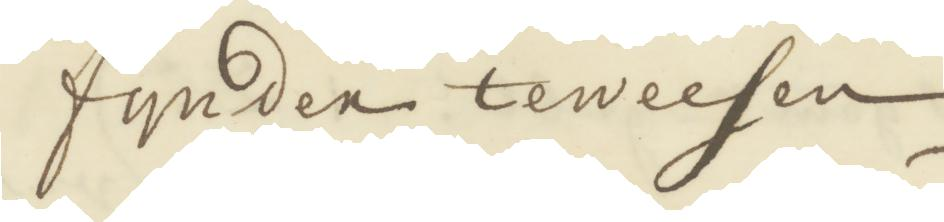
fynder te weesen
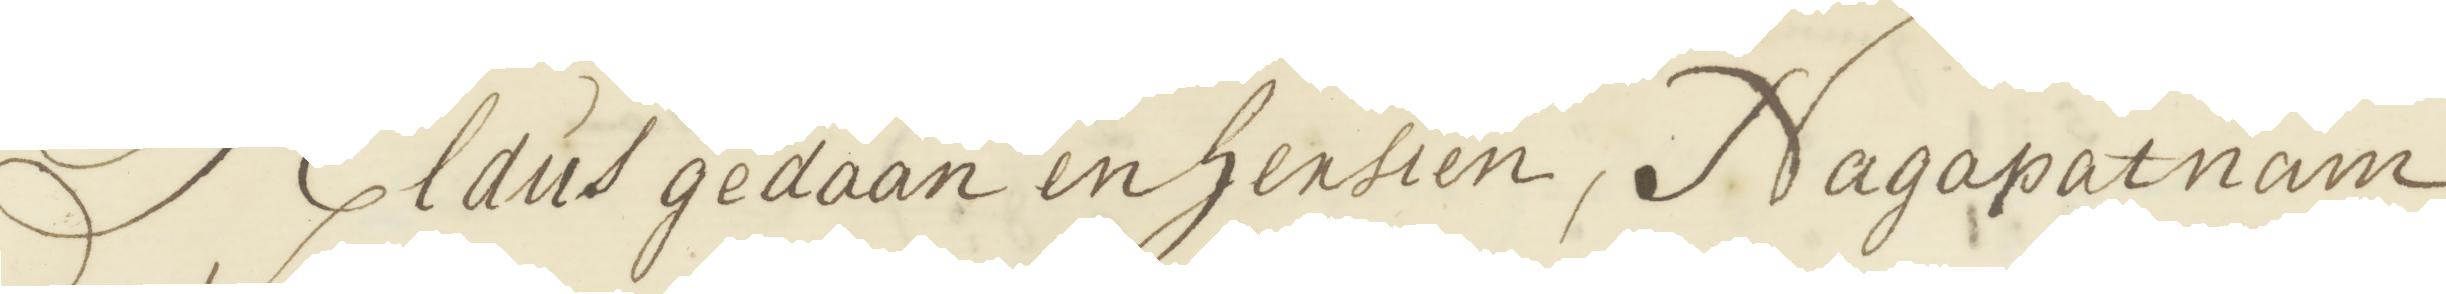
Aldus gedaan en hersien, Nagapatnam
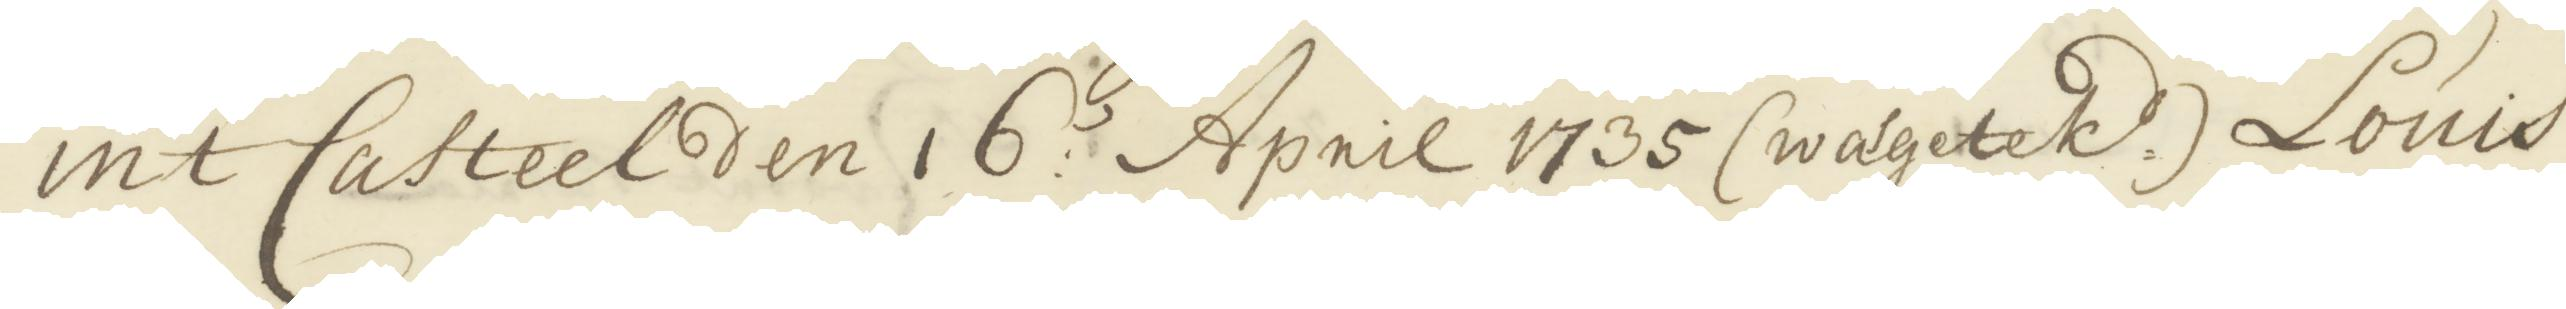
in't Casteel den 16:' April 1735 (was getek:d) Louis
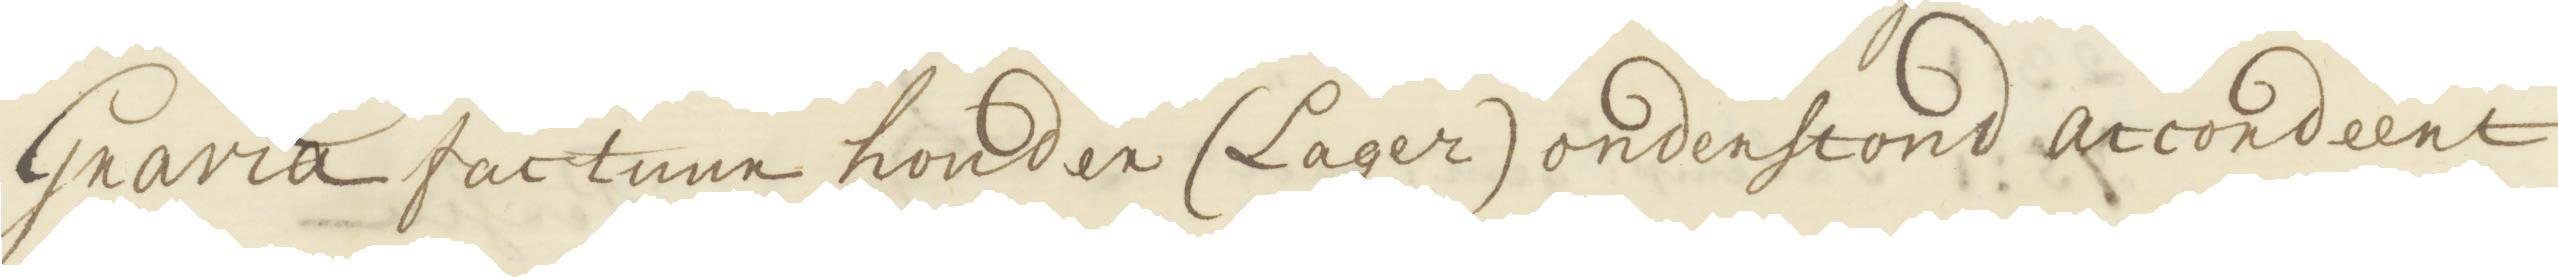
Gravia factuur houder (Lager) onder stond accordeert
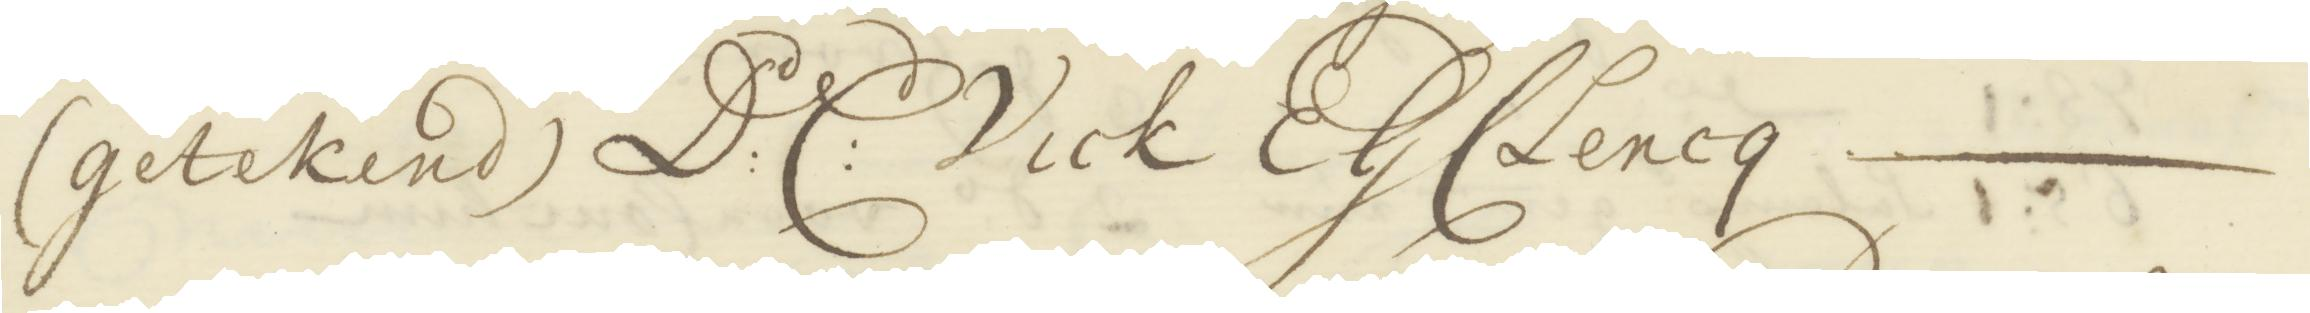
(getekend) D:d C:d Vick E G Clercq. —
